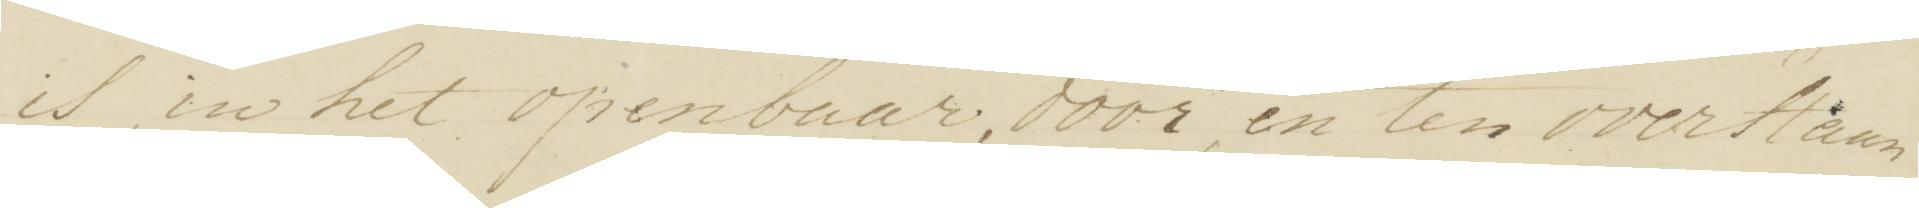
is, in het openbaar, door, en ten overstaan
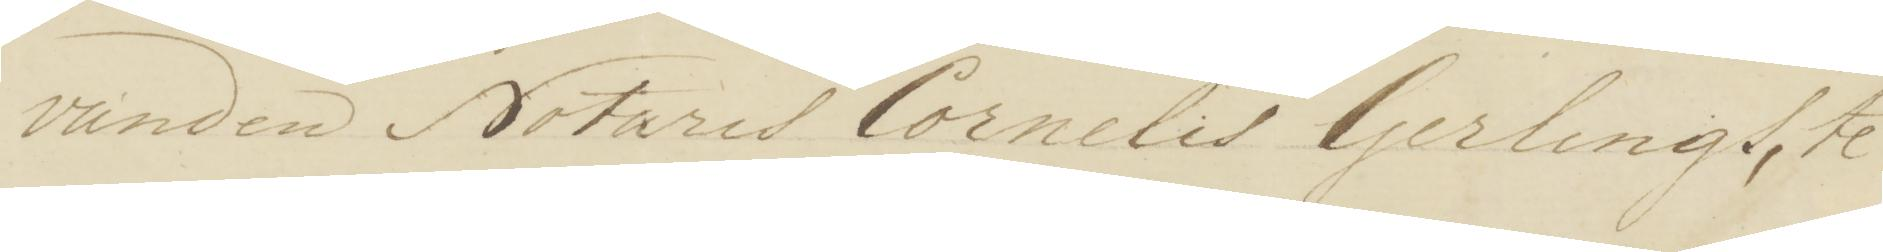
van den Notaris Cornelis Gerlings, te
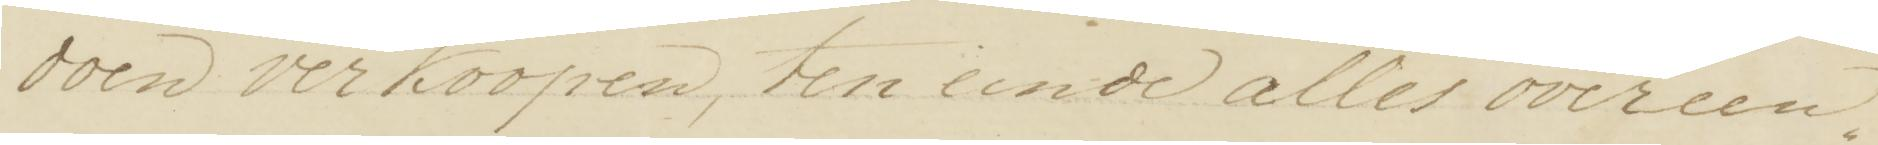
doen verkoopen, ten einde alles overeen„
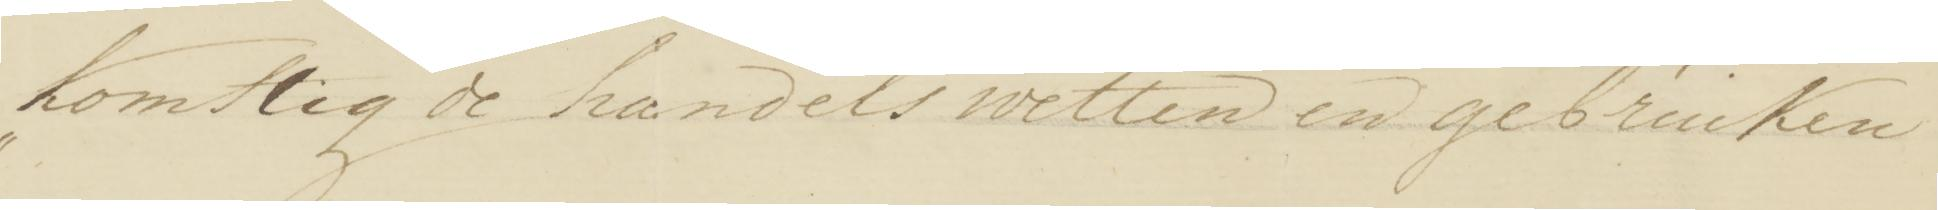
komstig de handelswetten en gebruiken
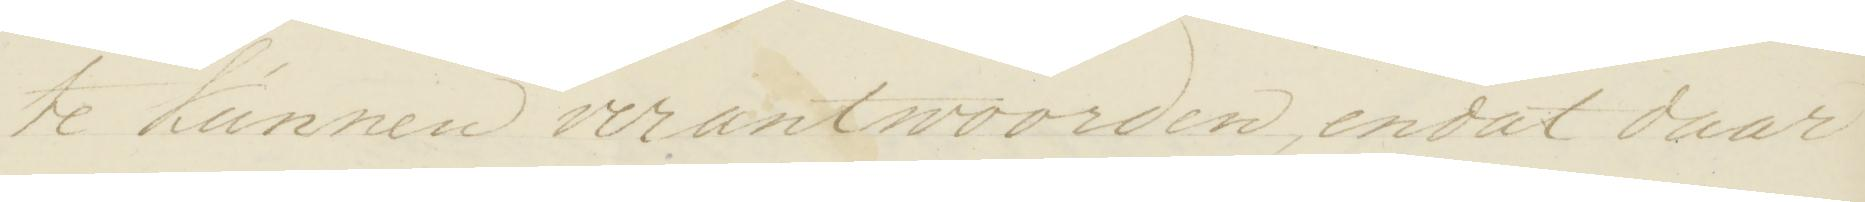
te kunnen verantwoorden, en dat daar
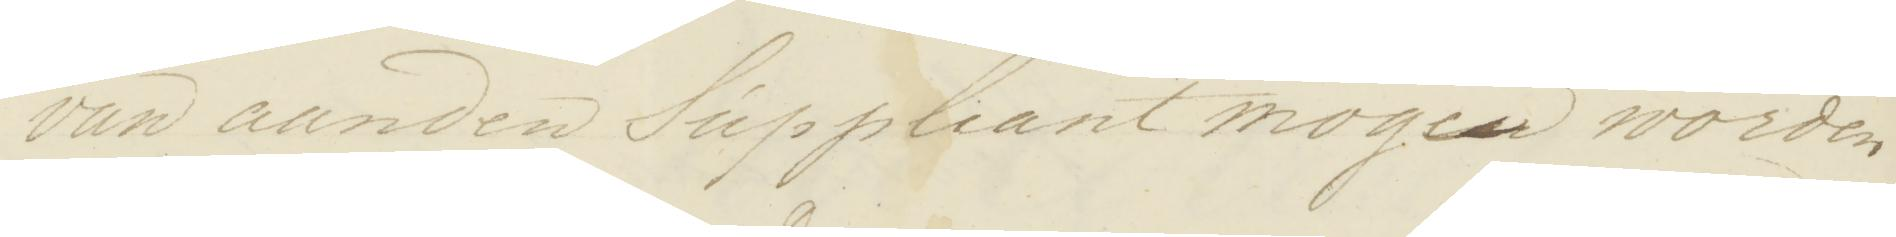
van aan den Suppliant mogen worden
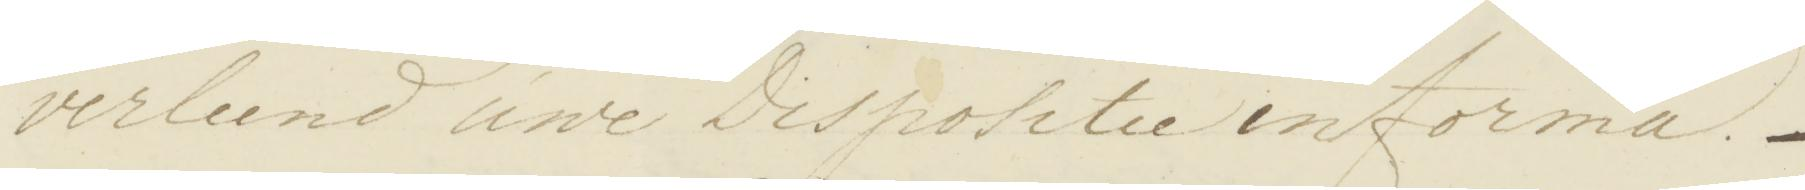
verleend uwe Dispositie in forma.-
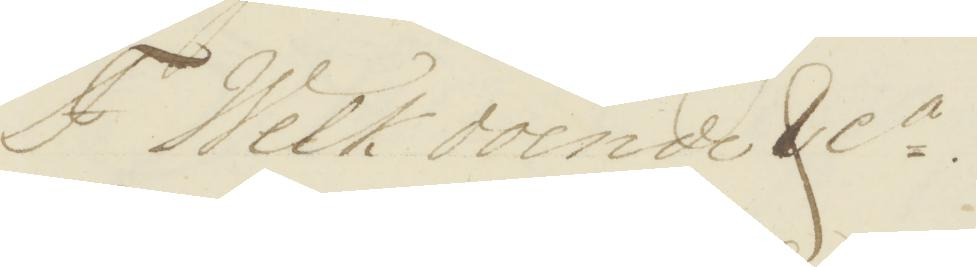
'T Welk doende &c=a
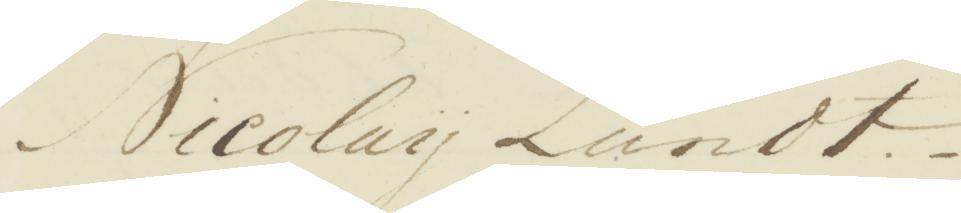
Nicolaij Landt.-
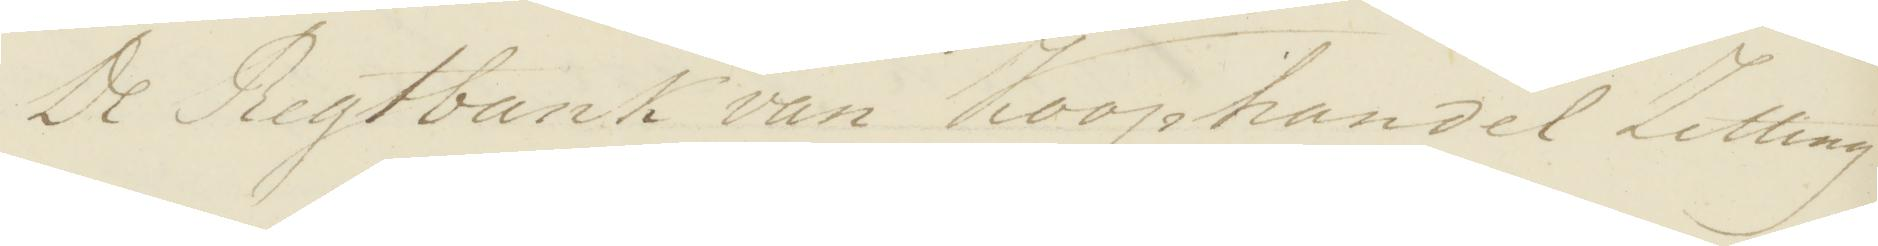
De Regtbank van Koophandel Zitting
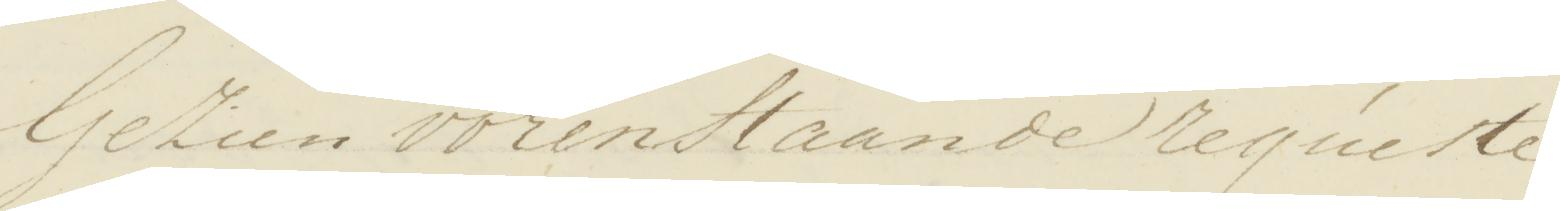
Gezien vorenstaande requeste
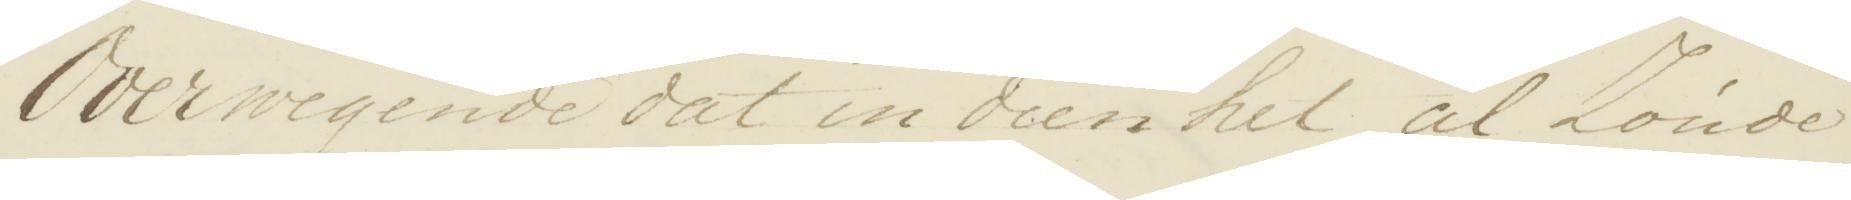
Overwegende dat in dien het al Zoude
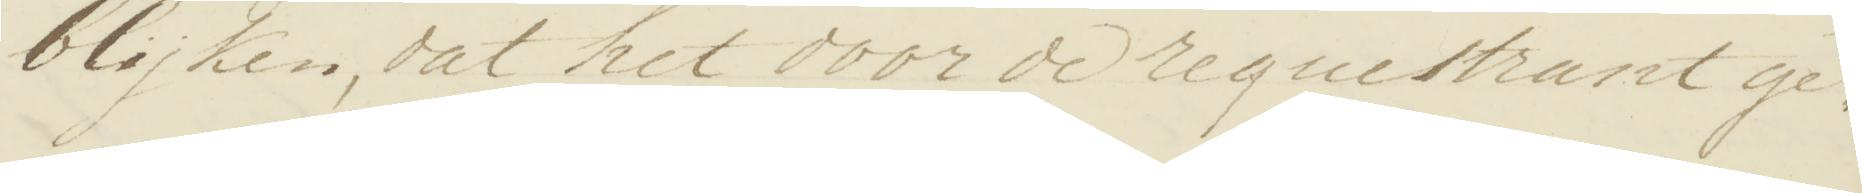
blijken, dat het door de requestrant ge„
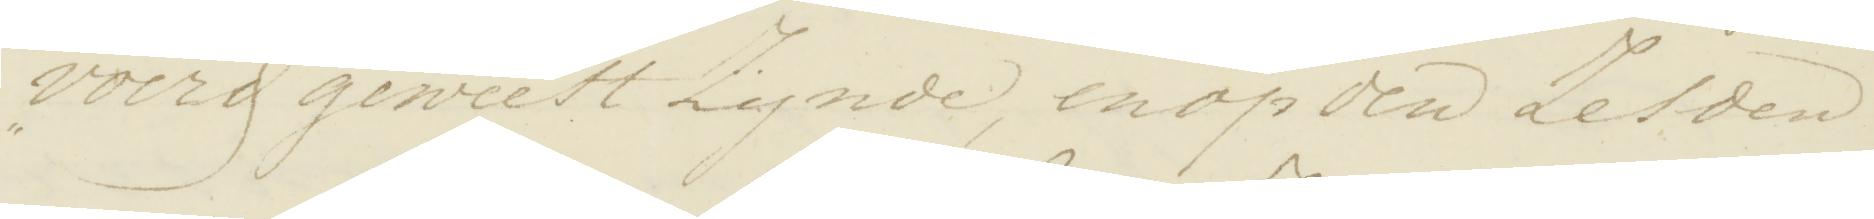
voerd geweest Zijnde, en op den Zesden
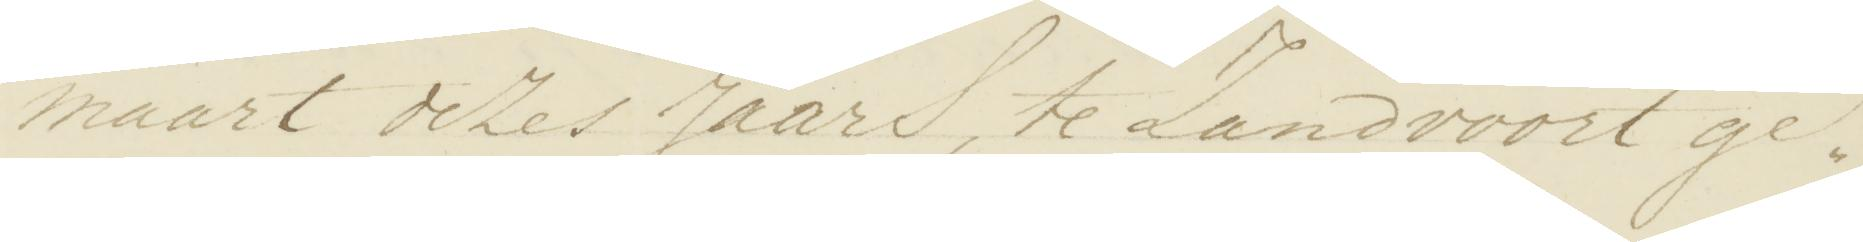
maart dezes jaars, te Zandvoort ge„
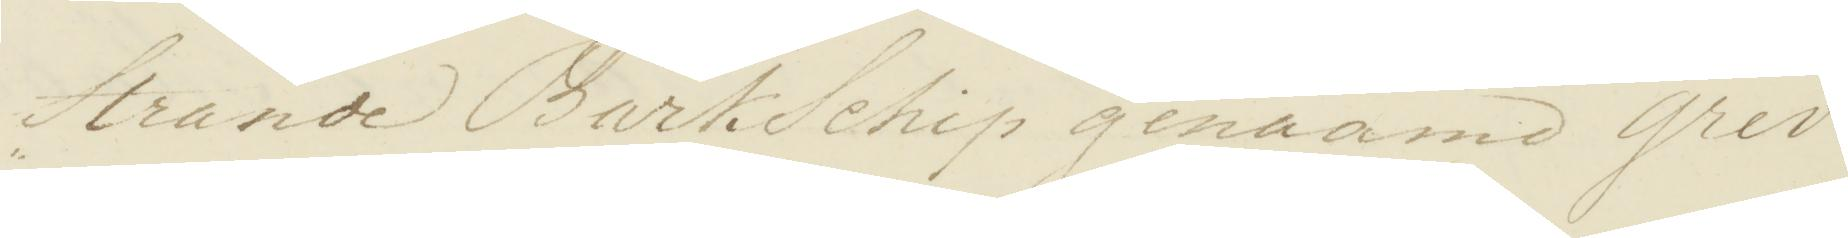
„strande Barkschip genaamd grev
